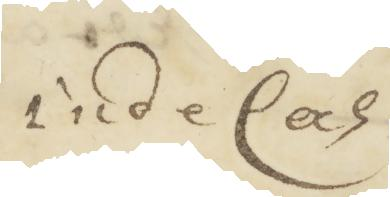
in de Cas
